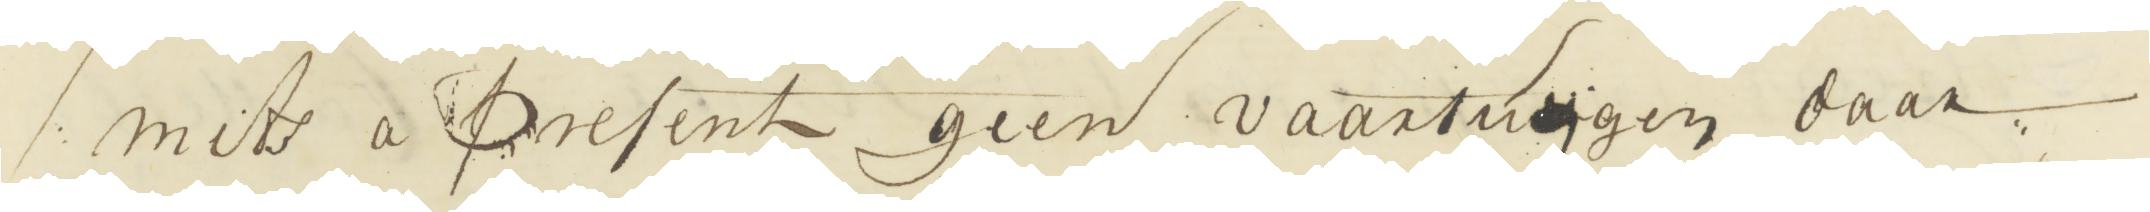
/:mits a present geen vaartuijgen daar„
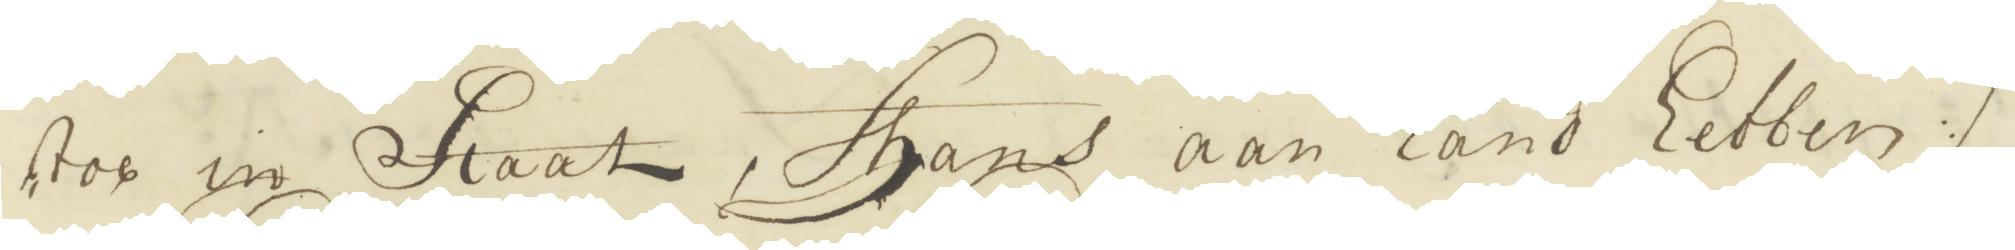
„toe in Staat, thans aan hand hebben:/
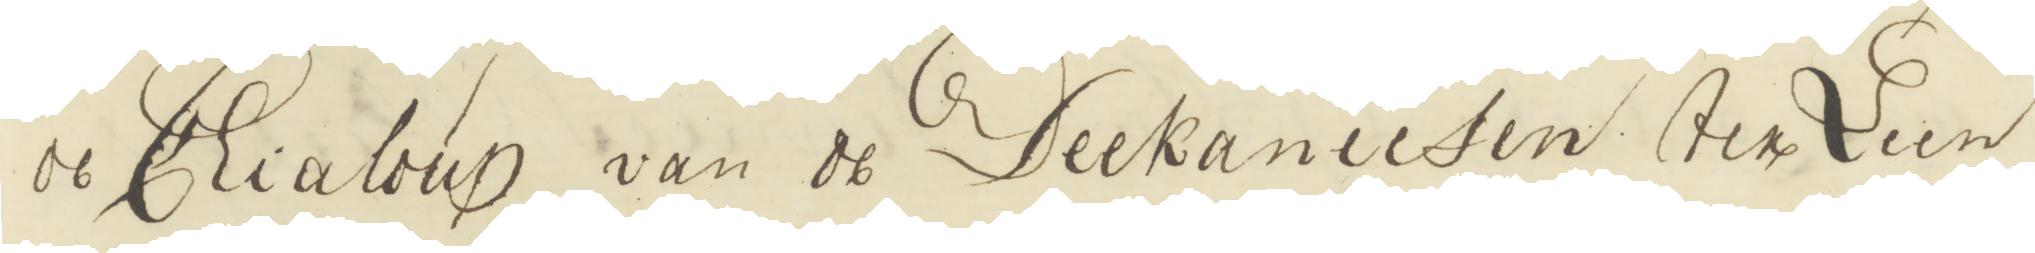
de Chialoup van de Deekaneesen ter Leen
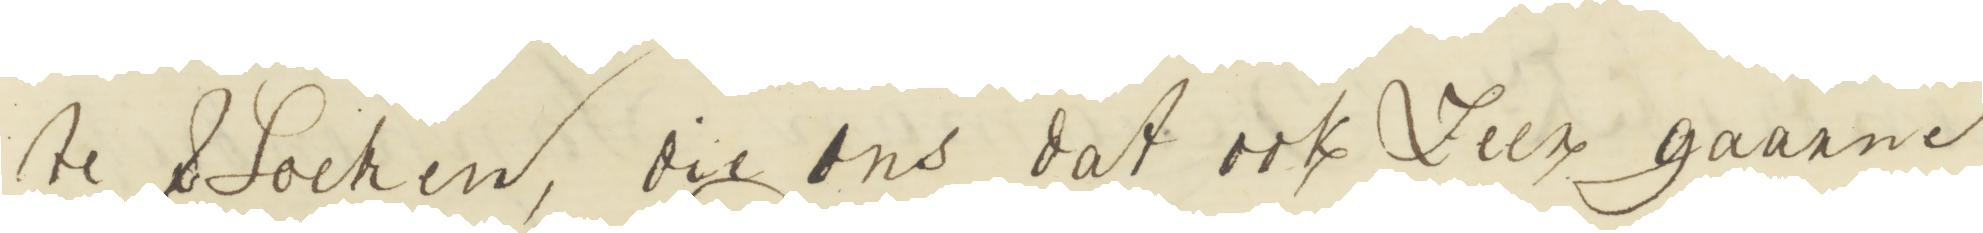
te versoeken, die ons dat ook zeer gaarne
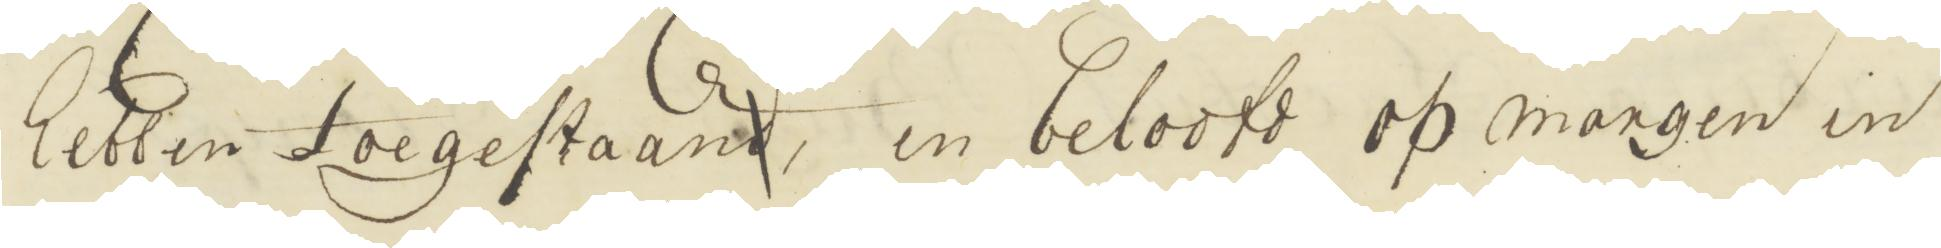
hebben toegestaand, en beloofd op morgen in
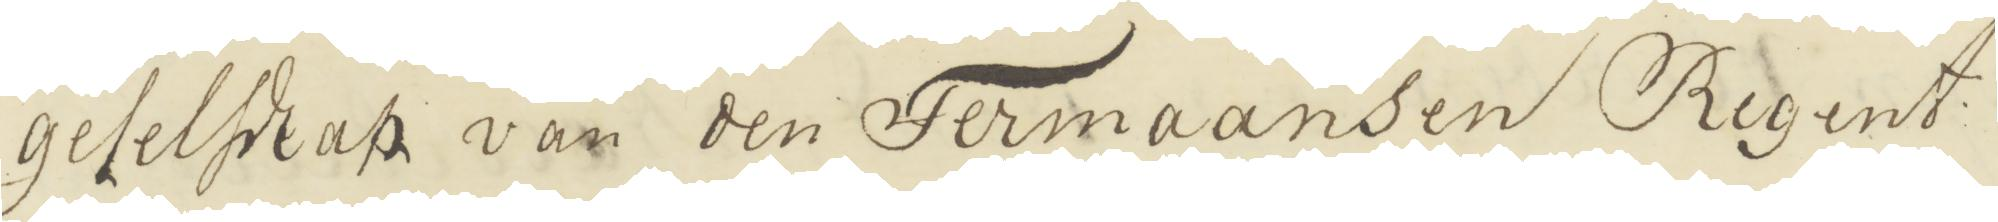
geselschap van den Termaansen Regent
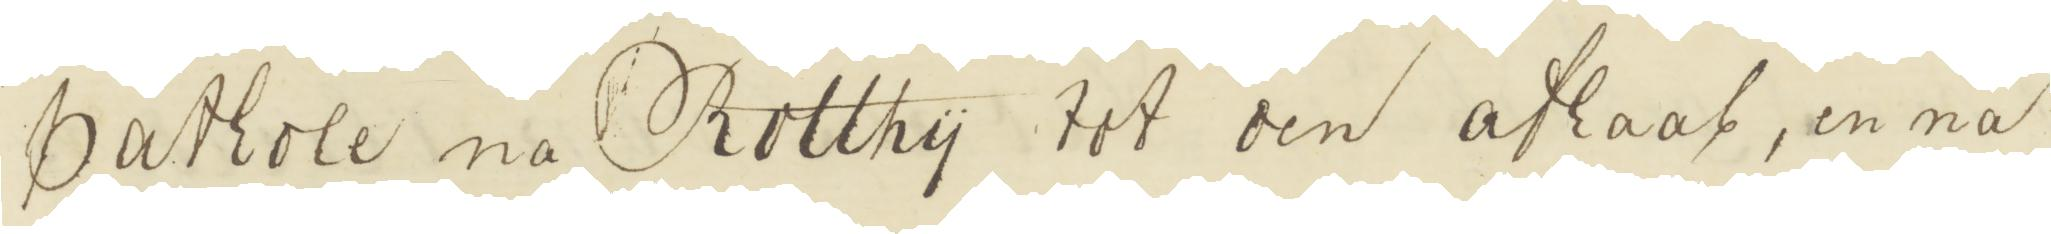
pathole na Rotthij tot den afhaal, en na
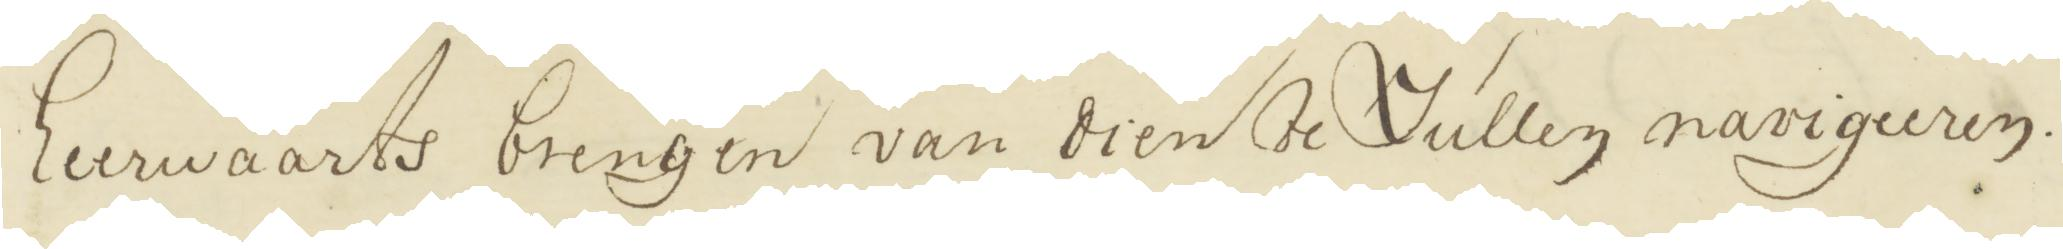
heerwaarts brengen van dien te zullen navigeeren.
